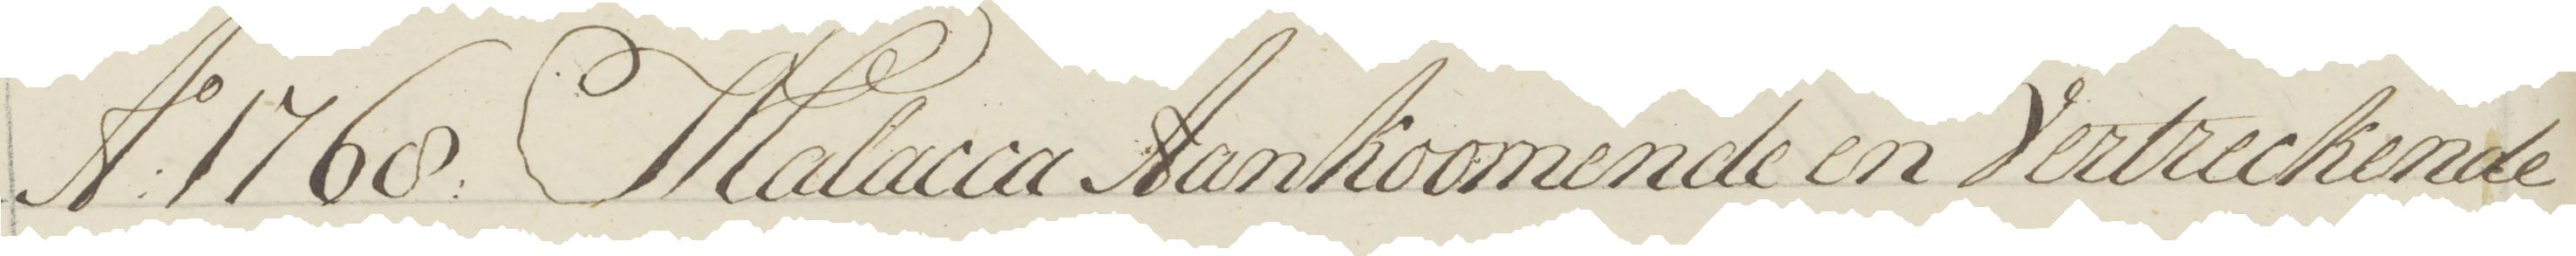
A:o 1768: Malacca Aankoomende en Vertreckende
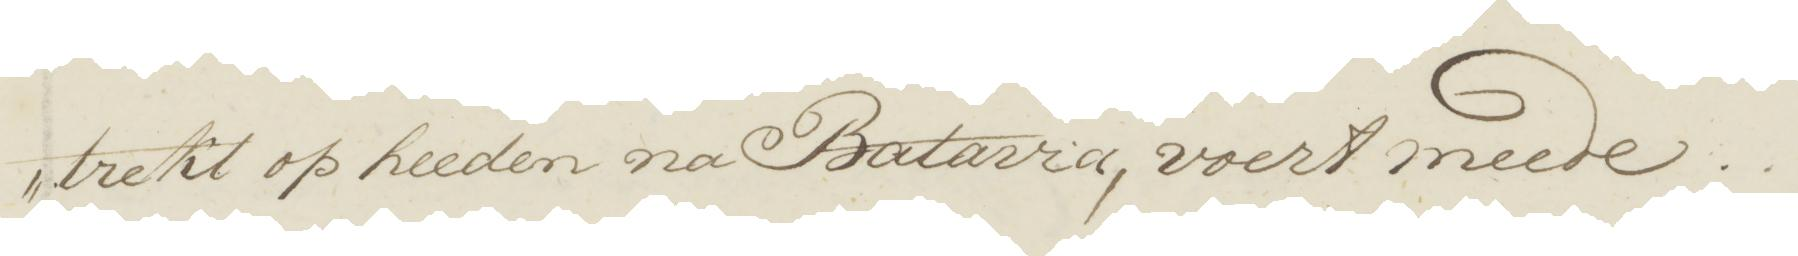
„trekt op heeden na Batavia, voert meede..
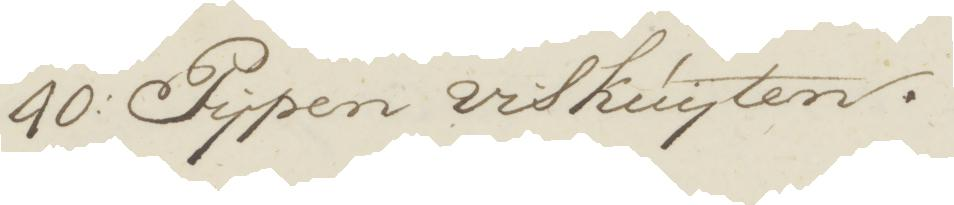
40: Pijpen viskuijten.
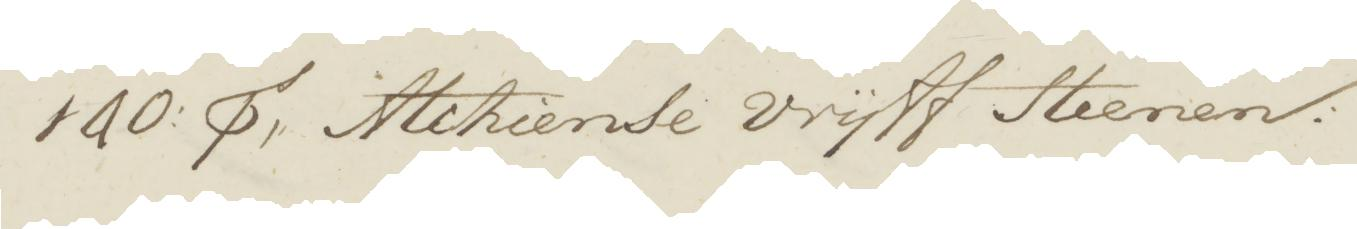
140: p„s Atchiense vrijff steenen:
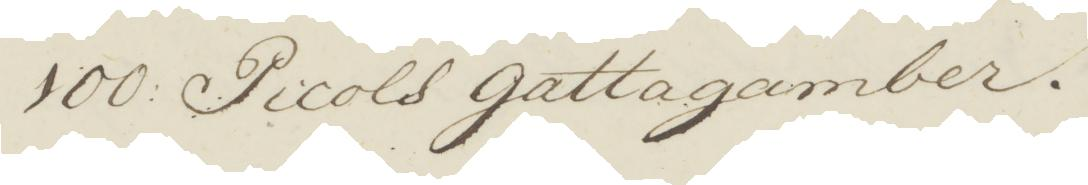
100: Picols gattagamber.
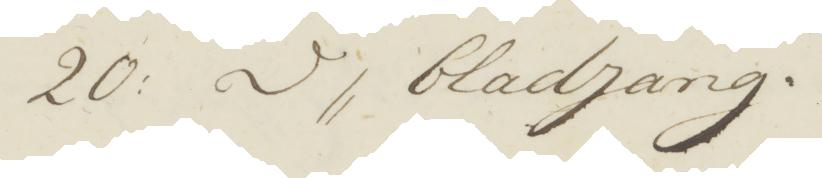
20: d„o bladjang.
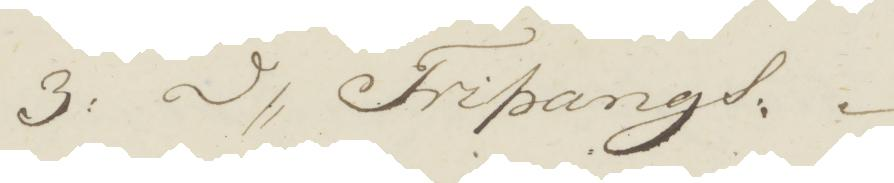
3: d„o Tripangs: —
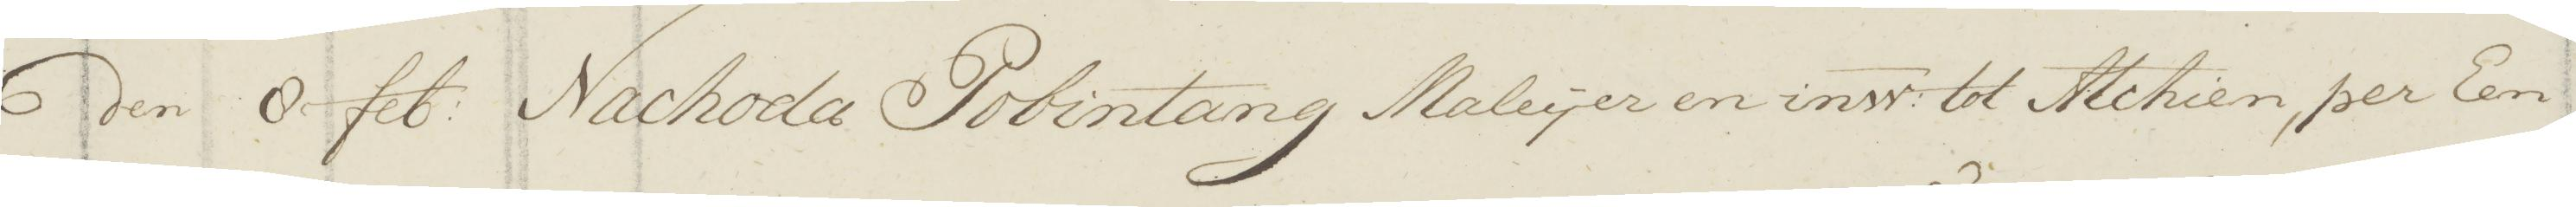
den 8, feb: Nachoda Pobintang Maleijer en inw: tot Atchien, per Een
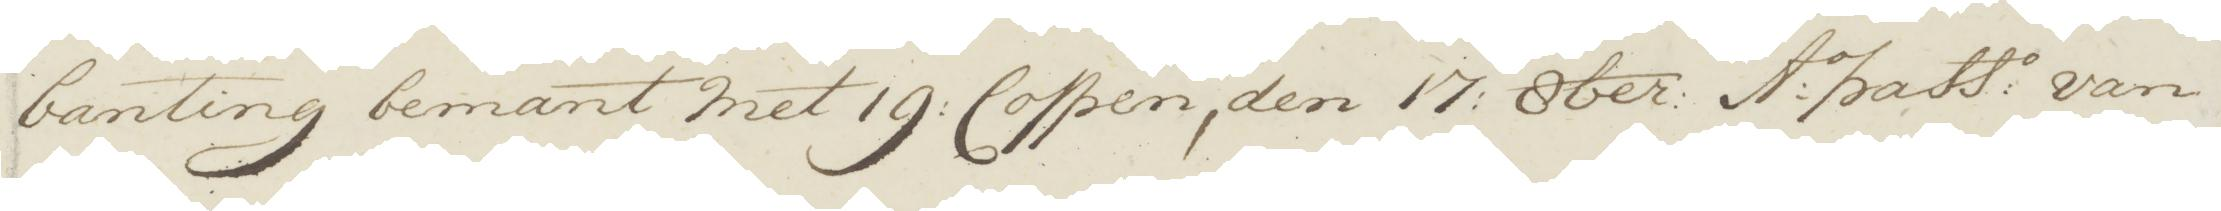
banting bemant met 19: Coppen, den 17:e 8ber: A:o pass:o van
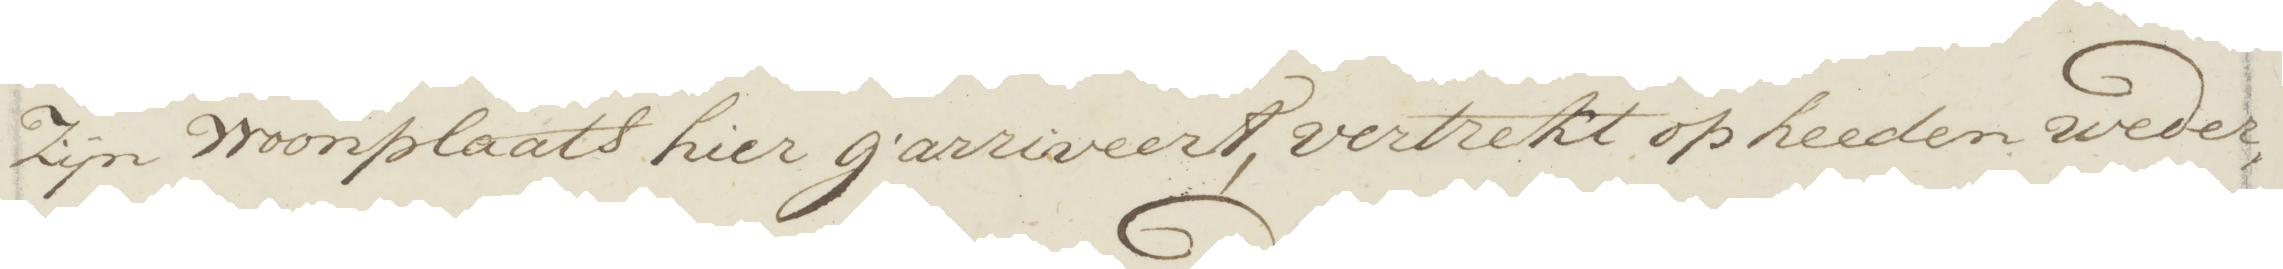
zijn woonplaats hier g’arriveert, vertrekt op heeden weder„
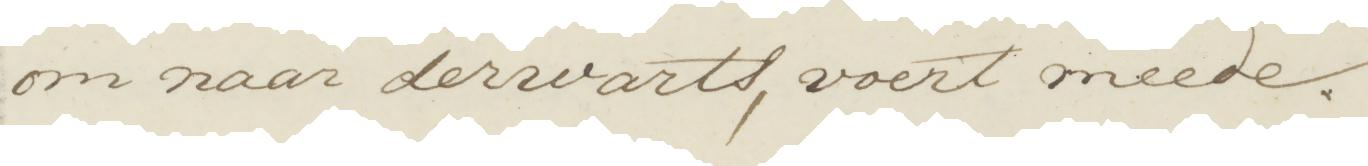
om naar derwarts, voert meede,
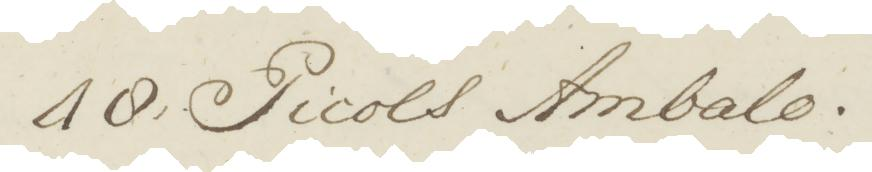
48, Picols Ambalo.
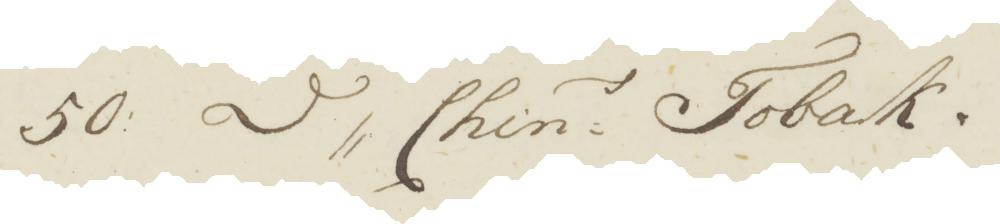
50: d„o Chin:s Tobak.
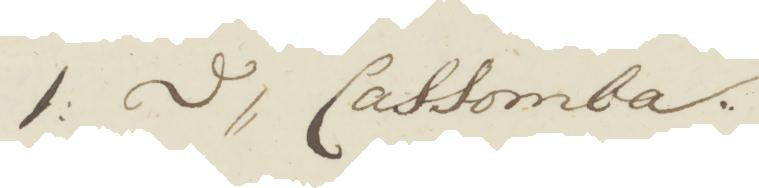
1: d„o Cassomba.
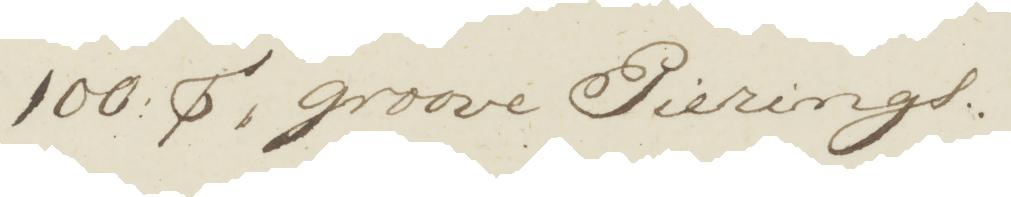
100: p„s groove Pierings.
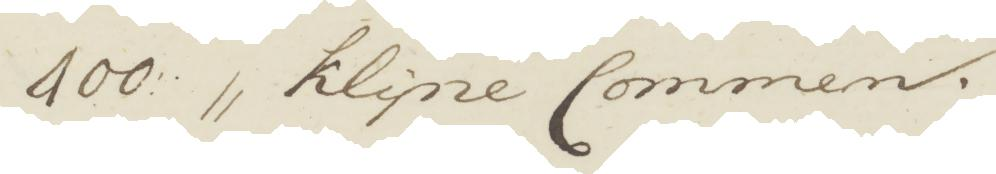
400: „ klijne Commen.
